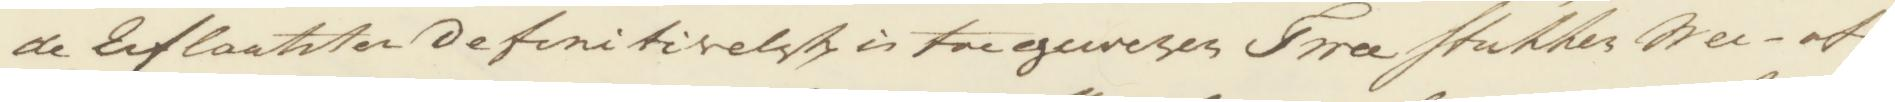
de Erflaatster definitivelyk is toegewezen Twee stukken Wei- of
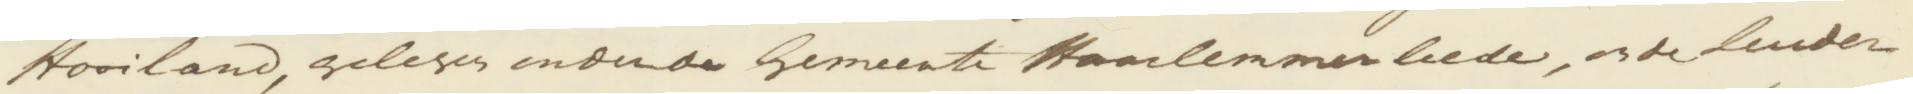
Hooiland, gelegen onder de Gemeente Haarlemmerliede, in de zuider
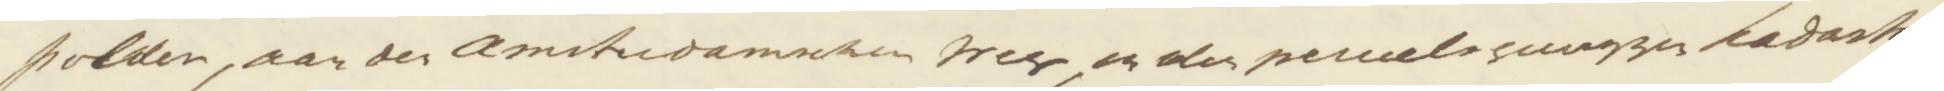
polder, aan den Amsterdamschen Weg, in den perceels gewyzen kadastra
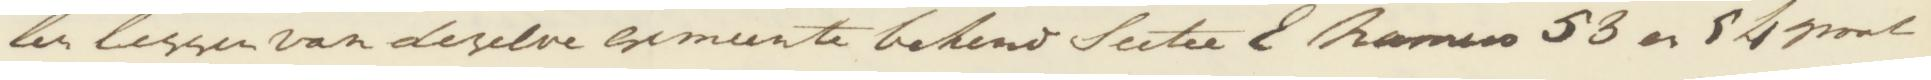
len legger van dezelve gemeente bekend sectie E Numero 53 en 54 groot
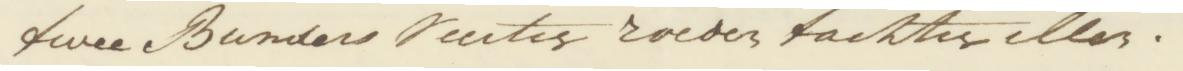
twee Bunders Veertig roeden tachtig ellen.
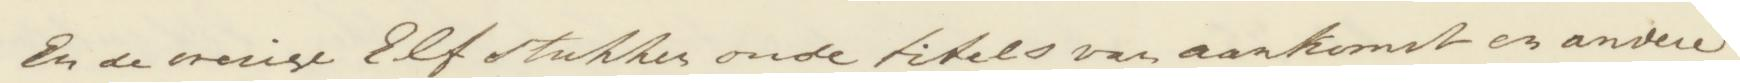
En de overige Elf stukken oude titels van aankomst en andere
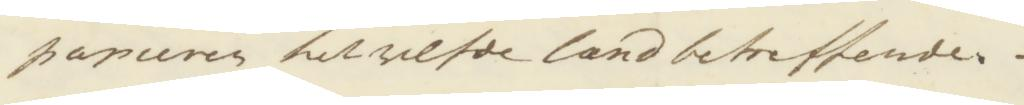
papieren het zelfde land betreffende.
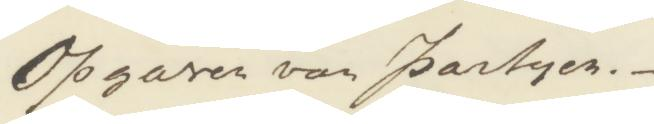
Opgaven van Partyen.-
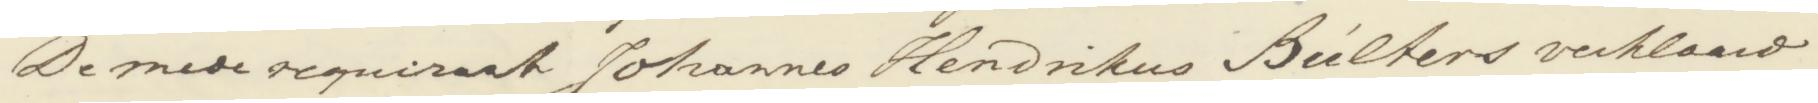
De mede requirant Johannes Hendrikus Bulters verklaard
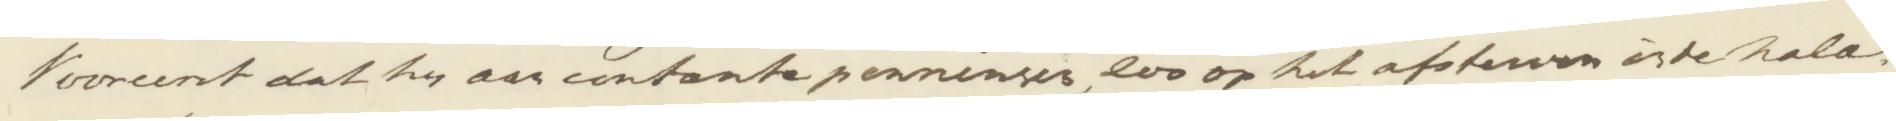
Vooreerst dat hy aan contante penningen, zoo op het afsterven in de nala„
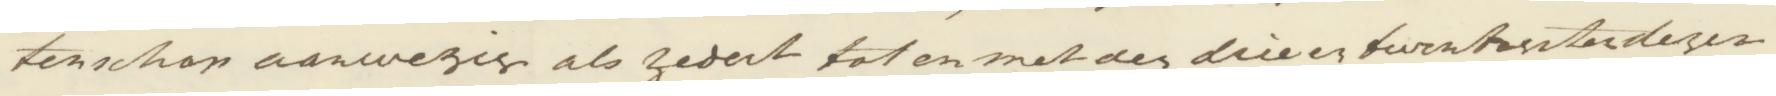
tenschap aanwezig als zedert tot en met den drie en twintigsten dezer
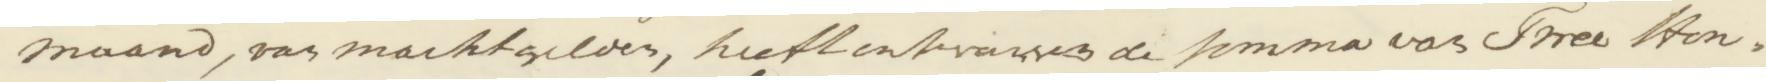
maand, van machtgelden, heeft ontvangen de somma van Twee Hon
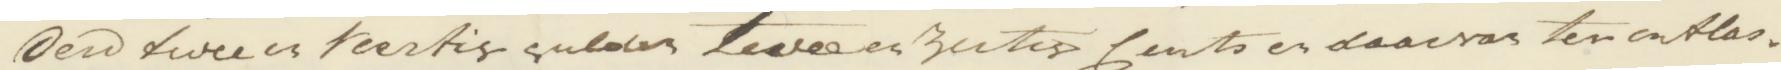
derd twee en Veertig gulden Twee en zestig Cents en daarvan ter ontlas„
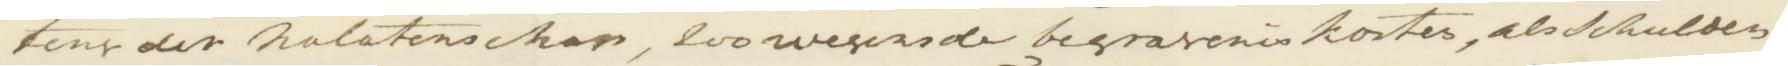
ting der nalatenschap, zoo wegens de begraveniskosten, als schulden
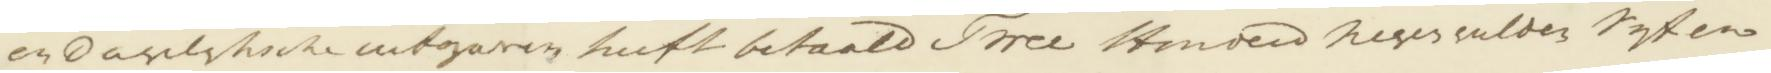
en dagelyksche uitgaven heeft betaald Twee Honderd negen gulden vyf en
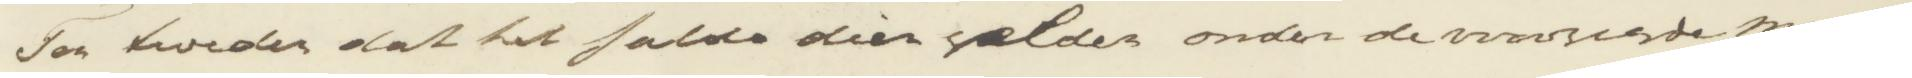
Ten tweden dat het saldo dien gelden onder de voorzegde munt
